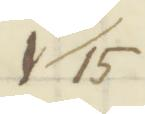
1 13/15
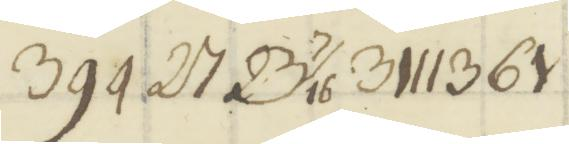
394 27 23 7/16 31113 61
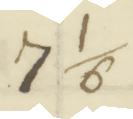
7 1/8
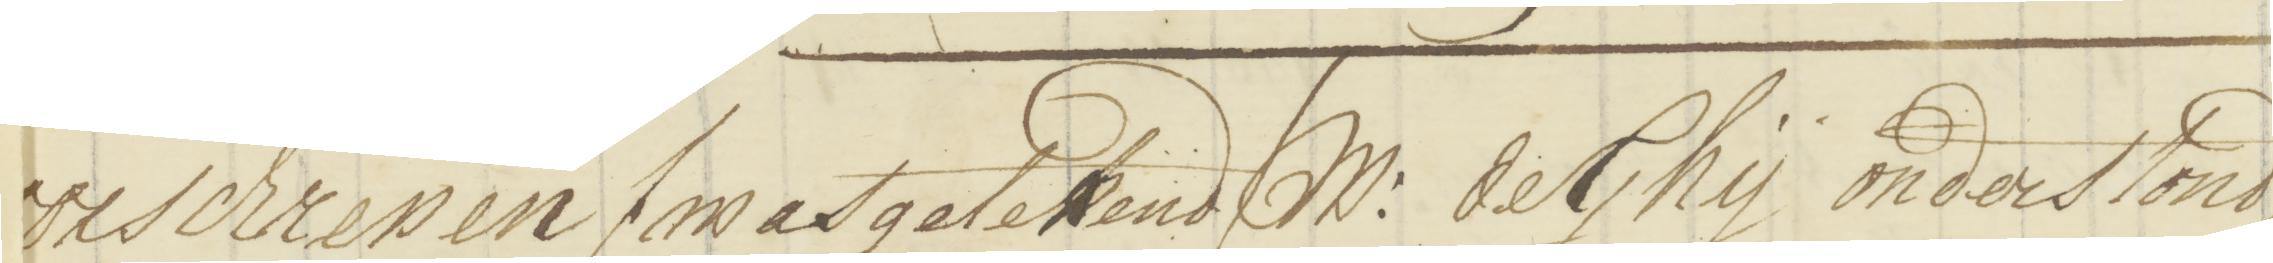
rschreven / was getekend/ W: de Ghij onderstond /
